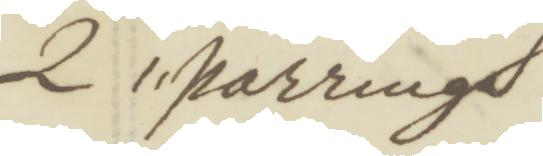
2 „ parrings
